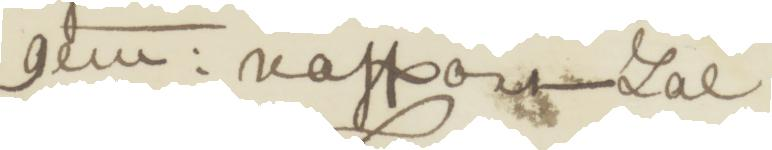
gem: rapport zal
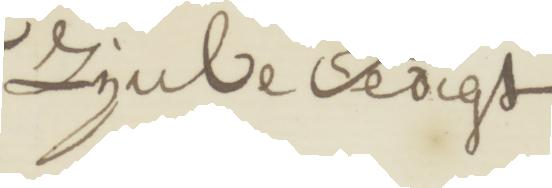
zijn be Eedigt
